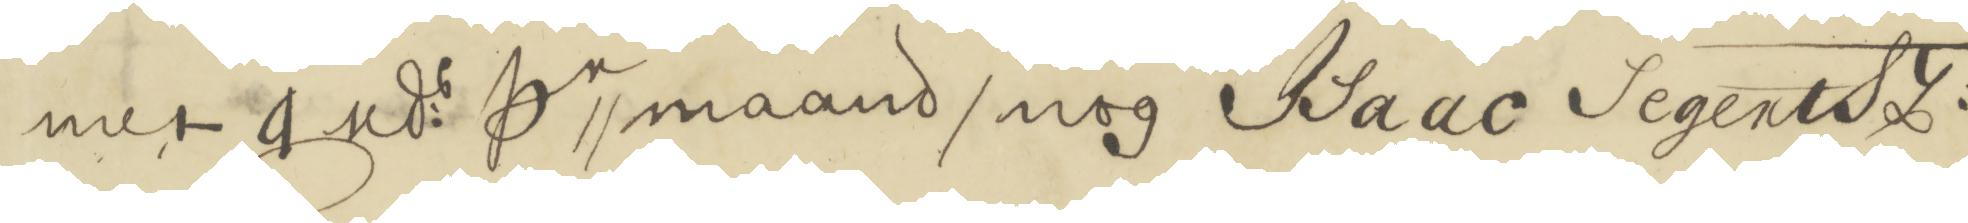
met 4 rd:s p„r maand / nog Isaac Segertsz:
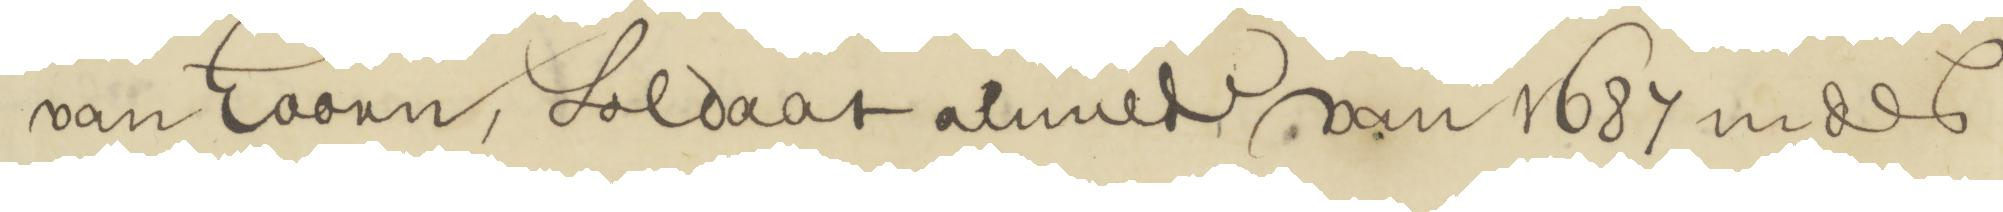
van hoorn, soldaat almede van 1687 in des
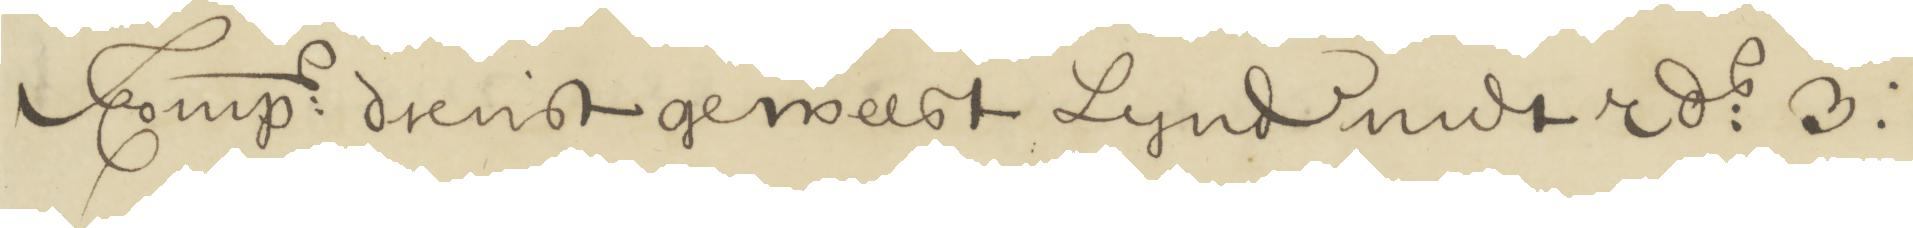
EComp:s dienst geweest zijnde met rd:s 3:
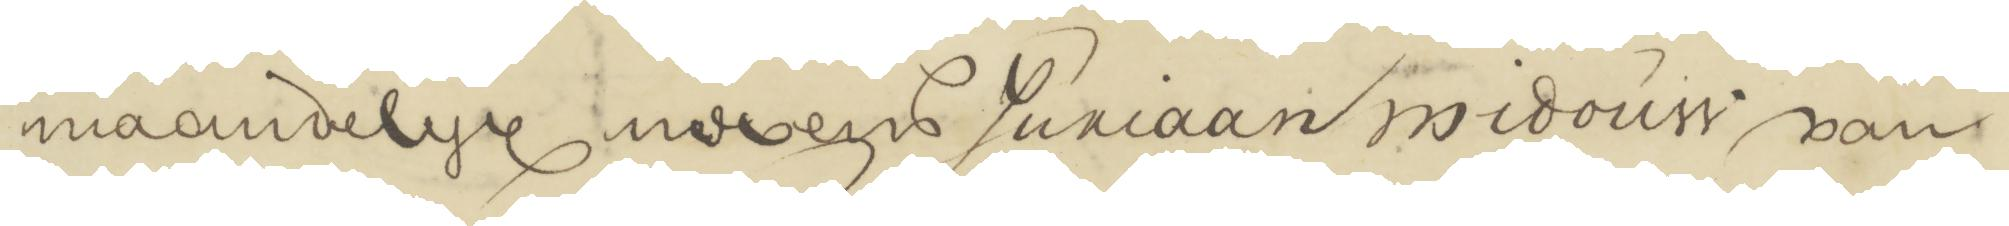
maandelijx nevens Juriaan widouw van
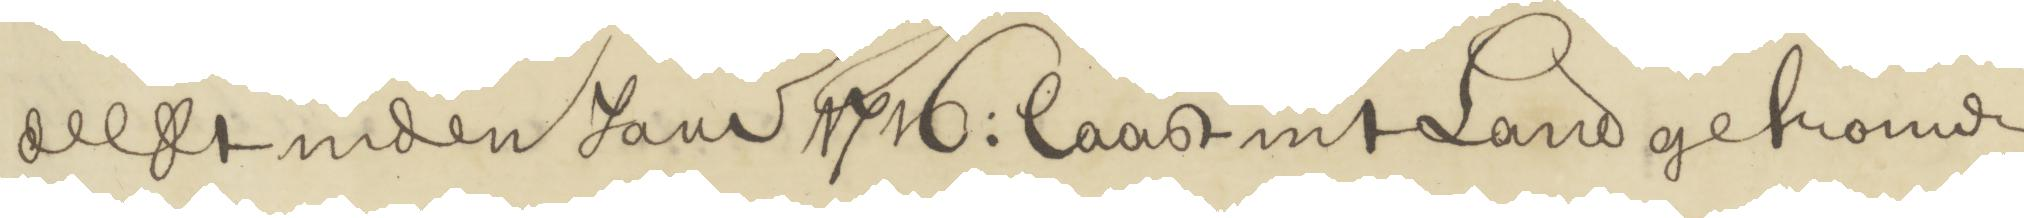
delft inden Iare 1716: laast in ’t Land gekomen
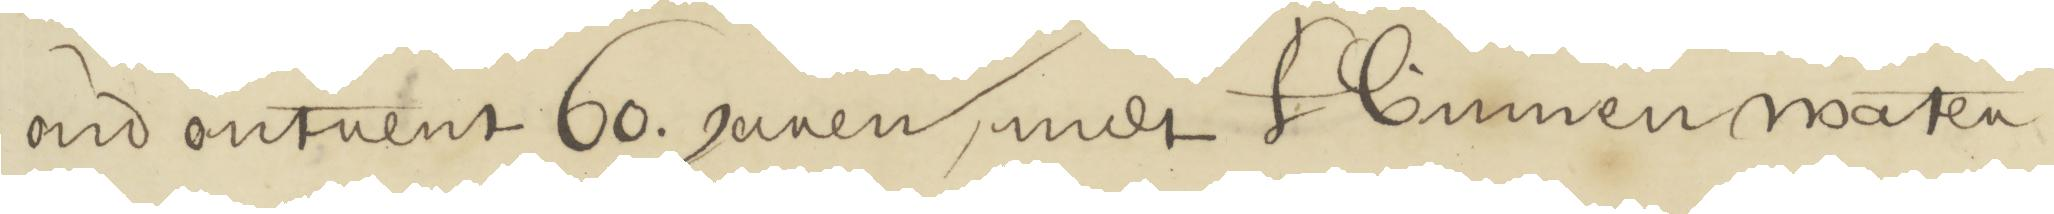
oud ontrent 60. jaren, met 't binnen water
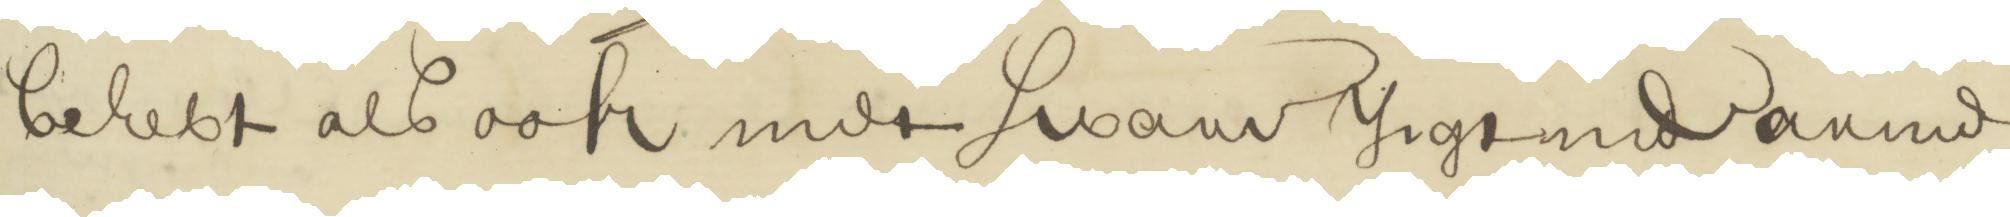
behebt als ook met sware Iigt inde armen
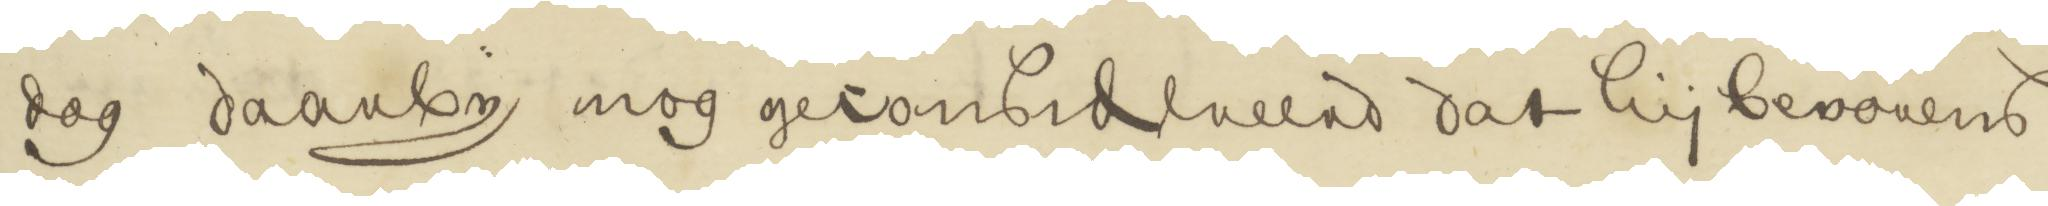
dog daarbij nog geconsidereerd dat hij bevorens
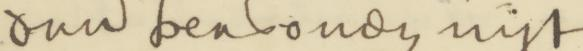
drie personden uijt
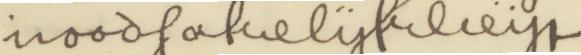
noodsakelijkheijt
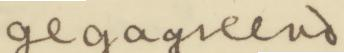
gegagieerd
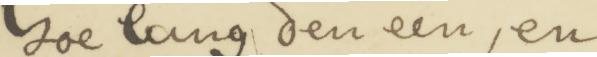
hoe lang den een, en
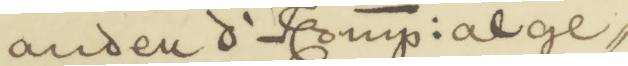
ander d’ EComp: alge„
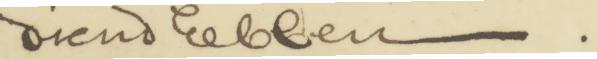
diend hebben.
